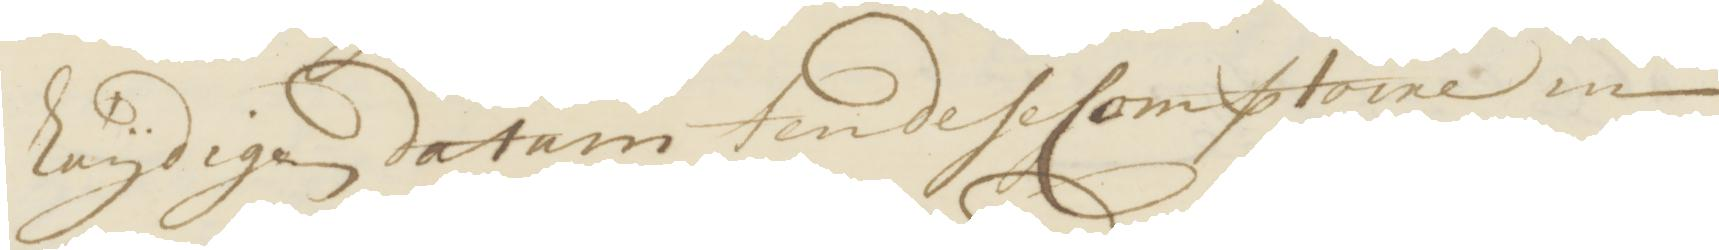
huijdigen datum ten dese Comptoire in
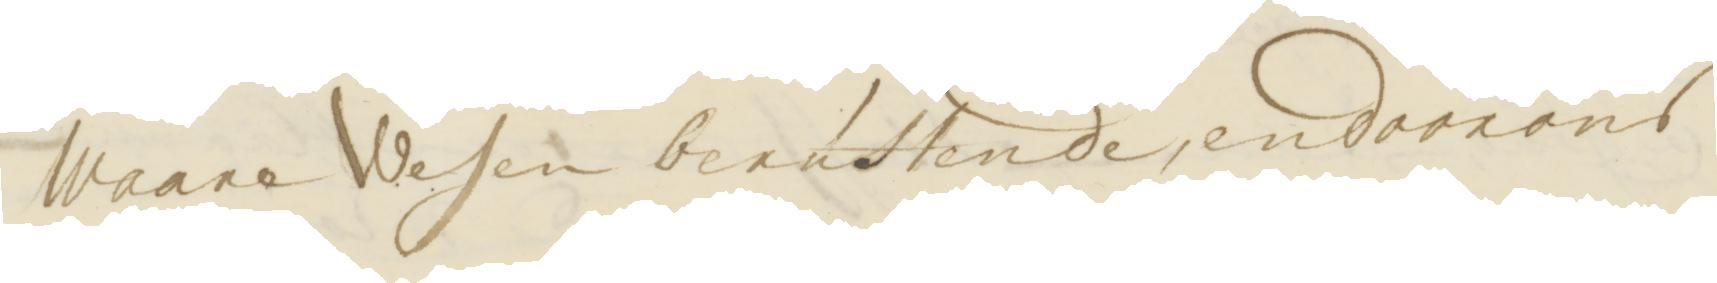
Waare Wesen berustende, en door ons
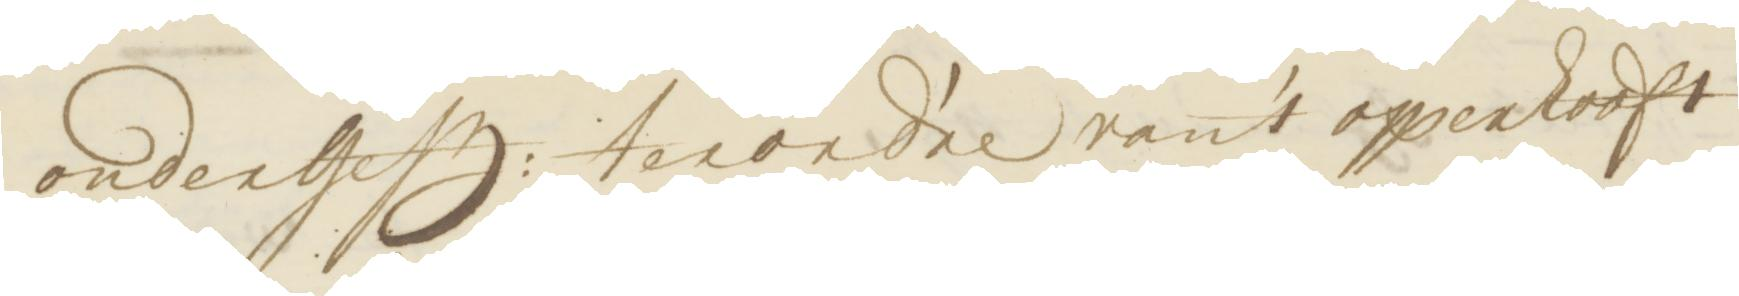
ondergesz: ter ord're van’t opperhooft
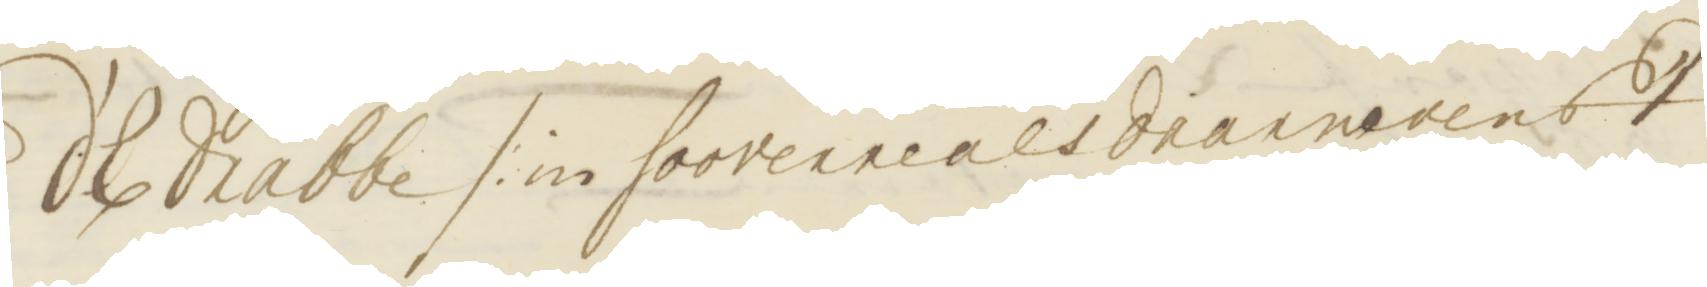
d'E drabbe /: in soo verre als daarnevens/
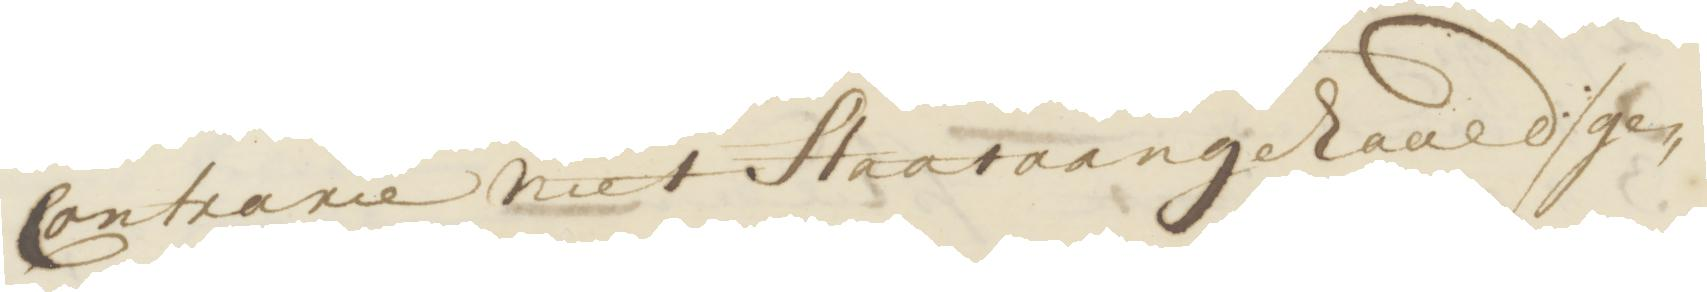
contrarie niet Staat aan gehaald:/ ge„
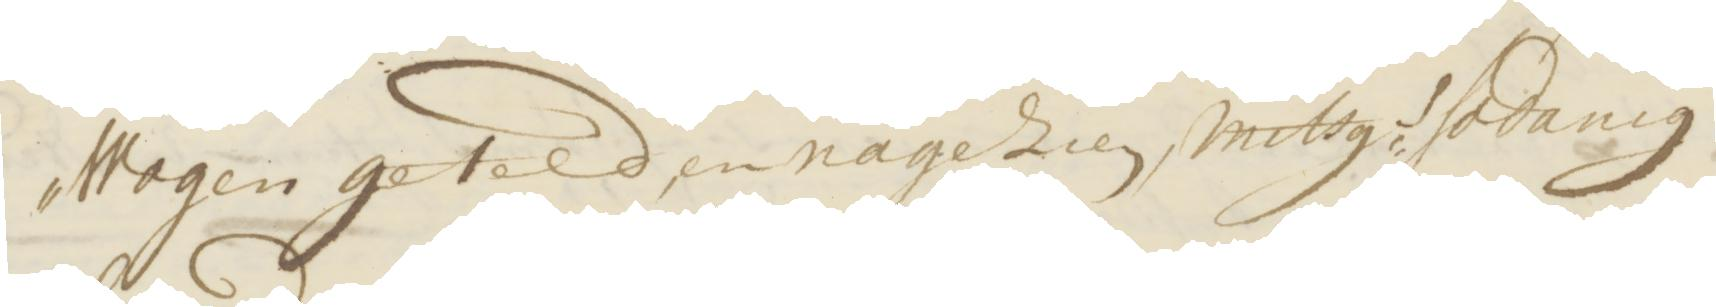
„wogen geteld, en nagezien, mitsg„s sodanig
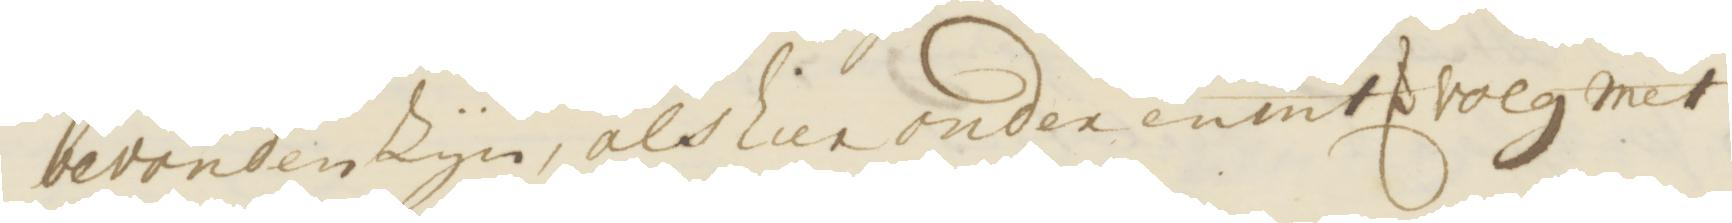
bevonden Zijn, als hier onder en in't vervolg met
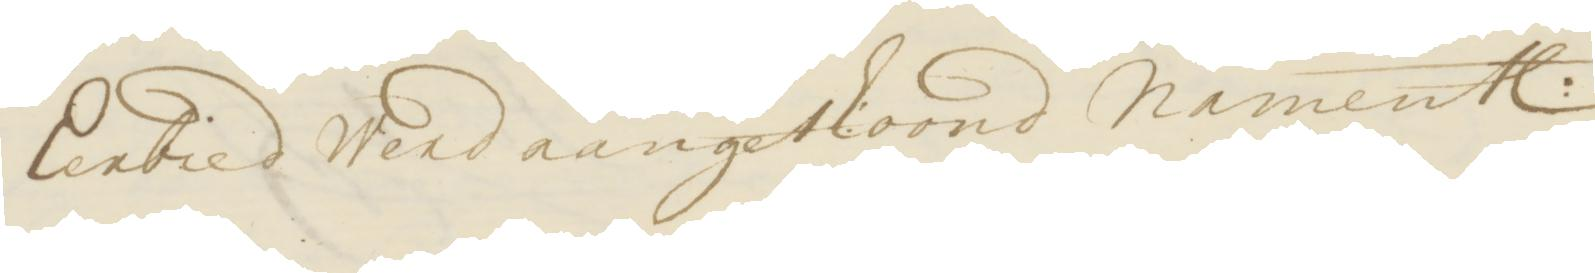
Eerbied werd aan gethoond namentl:
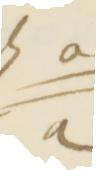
R:o=a
